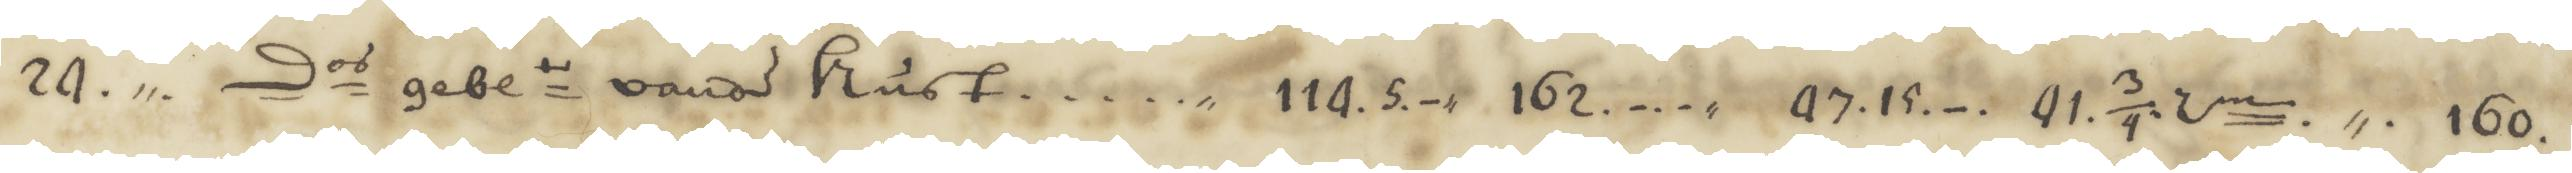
24. „. d=os gebl=te vande kust . . . . . „ 114.5. — „ 162. —. — „ 47.15. —. 41.3/4. r=m. „. 160.
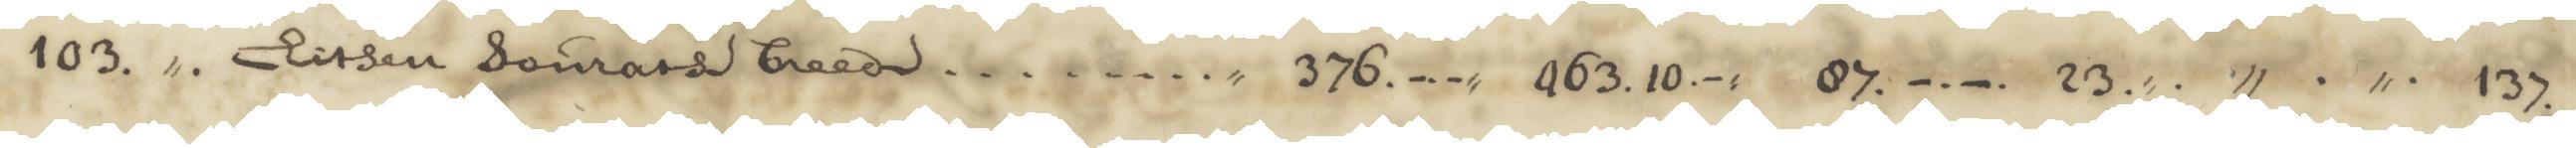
103. „. chitsen souratse breede . . . . . . . . „ 376. — . — „ 463. 10. — „ 87. —. —. 23. „. „. „. 137.
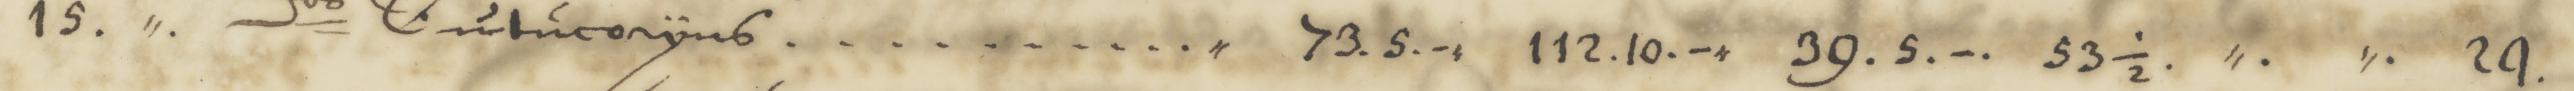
15. „. d=os Tutucorijns . . . . . . . . . . „ 73.5. — „ 112.10. — „ 39.5. —. 53½. „. „. 24.
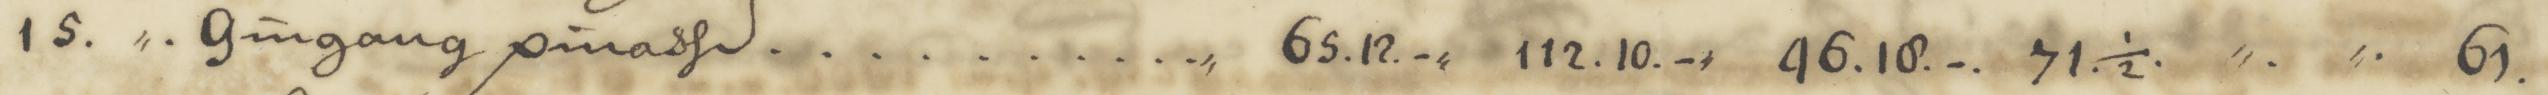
15. „. Gingang pinasse . . . . . . . . . . „ 65.12. — „ 112.10. — „ 46.18. —. 71.½. „. „. 61.
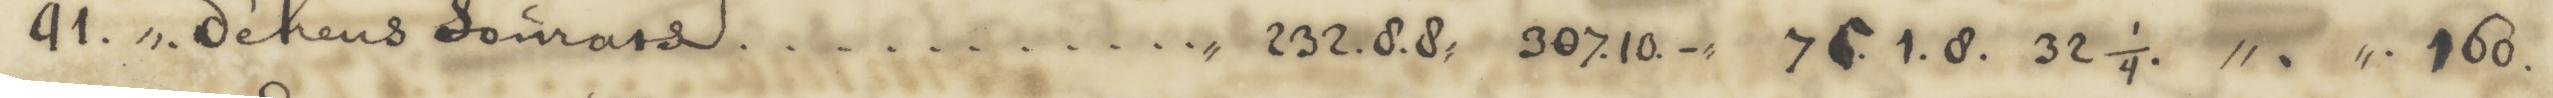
41. „. dekens souratse . . . . . . . . . . . „ 232.8.8 „ 307.10. — „ 75.1.8. 32 1/4. „. „. 160.
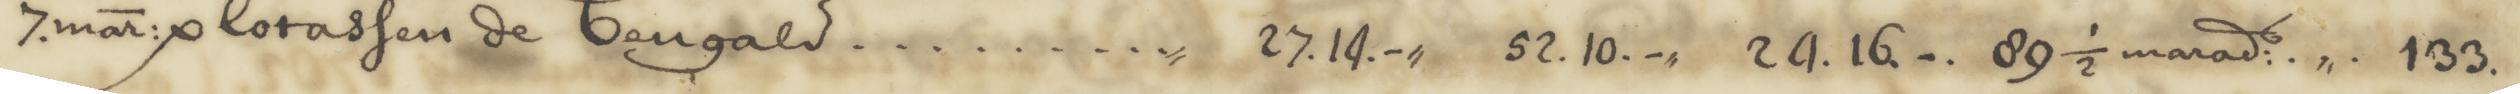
7. mar: photassen de bengale . . . . . . . . . „ 27.14. — „ 52.10. — „ 24.16. —. 89½ marad:s . „. 133.
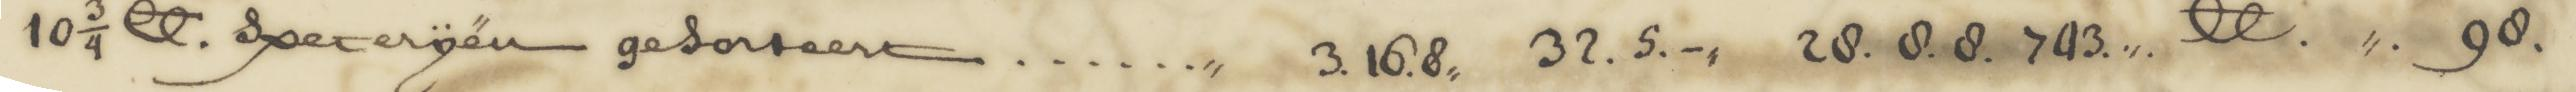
10 3/4 lb. specerijën gesorteert . . . . . . . „ 3.16.8 „ 32.5. — „ 28.8.8. 743. „. lb. „. 98.
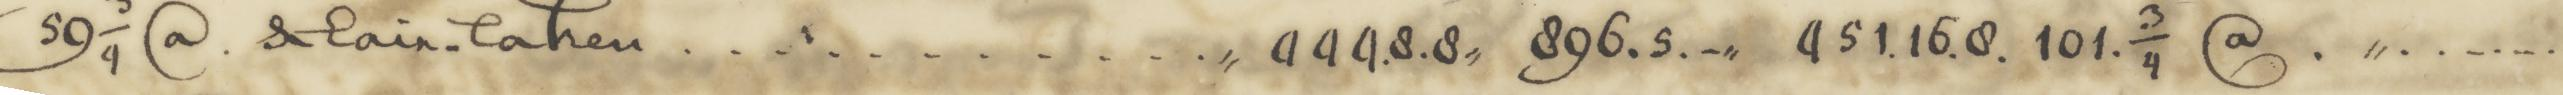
59 3/4 @. schair-laken . . . . . . . . . . . . „ 444.8.8 „ 896.5. — „ 451.16.8. 101.3/4 @ . „. . - . - .
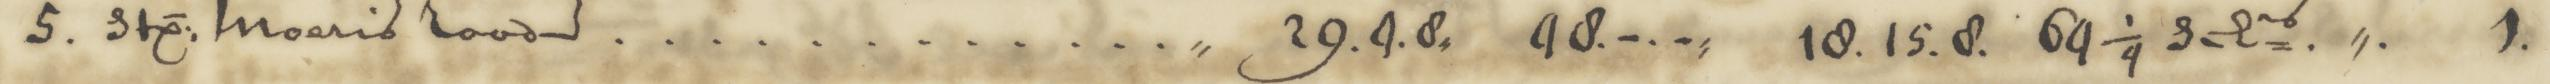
5. stx: moeris roode . . . . . . . . . . . . „ 29.4.8 „ 48. —. — „ 18.15.8. 64¼ sch=rs „. 1.
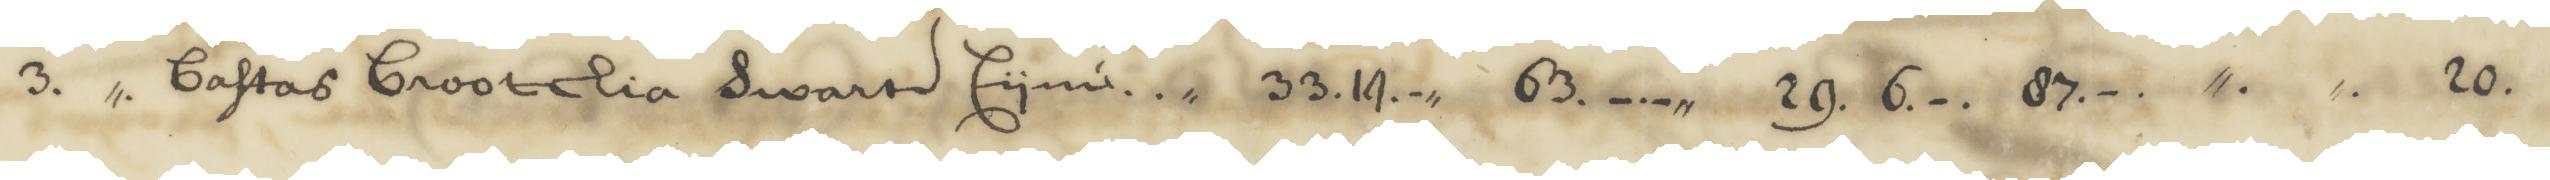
3. „. bastas brootchia swarte fijne . . „ 33.14. — „ 63. —. — „ 29. 6. —. 87. —. „. „. 20.
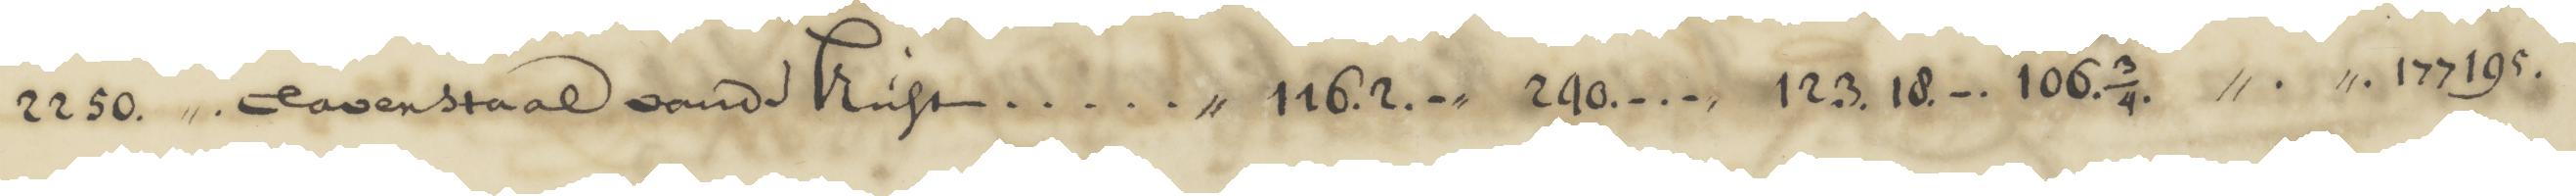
2250. „. claverstaal vande kust . . . . . „ 116. 2. — „ 240. —. — „ 123.18. —. 106.3/4. „. „. 177195.
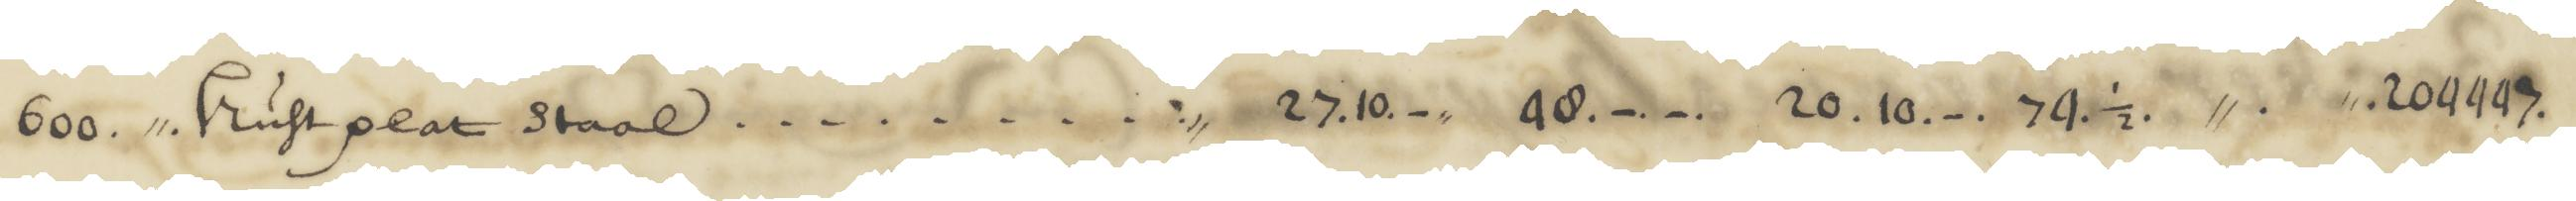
600. „. kust plat staal . . . . . . . . . „ 27.10. — „ 48. —. —. 20. 0. —. 74.½. „. „. 204447.
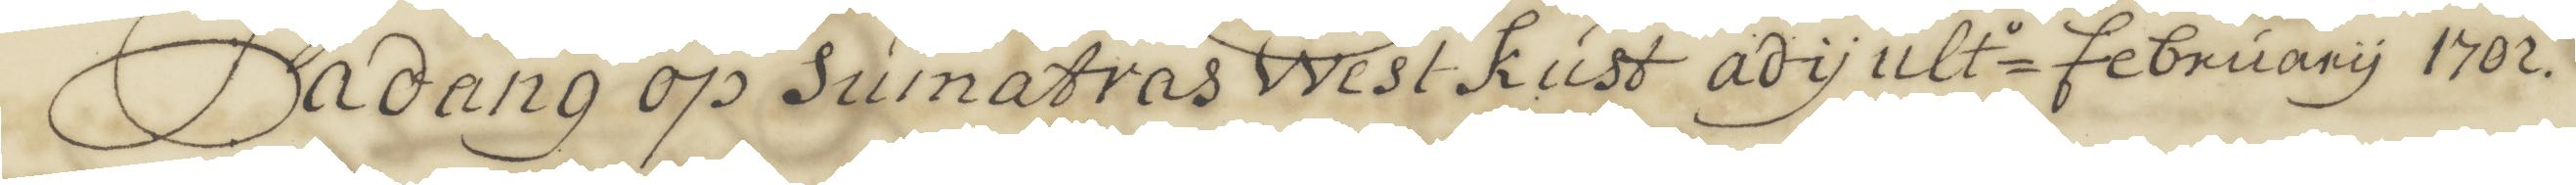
Padang op sumatras west kust adij ult=o februarij 1702.
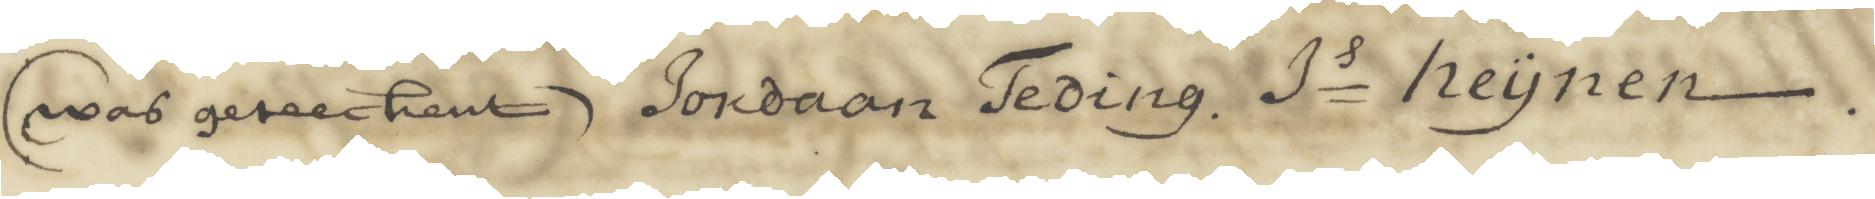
(was geteeckent) Jordaan Teding. J=s heijnen.
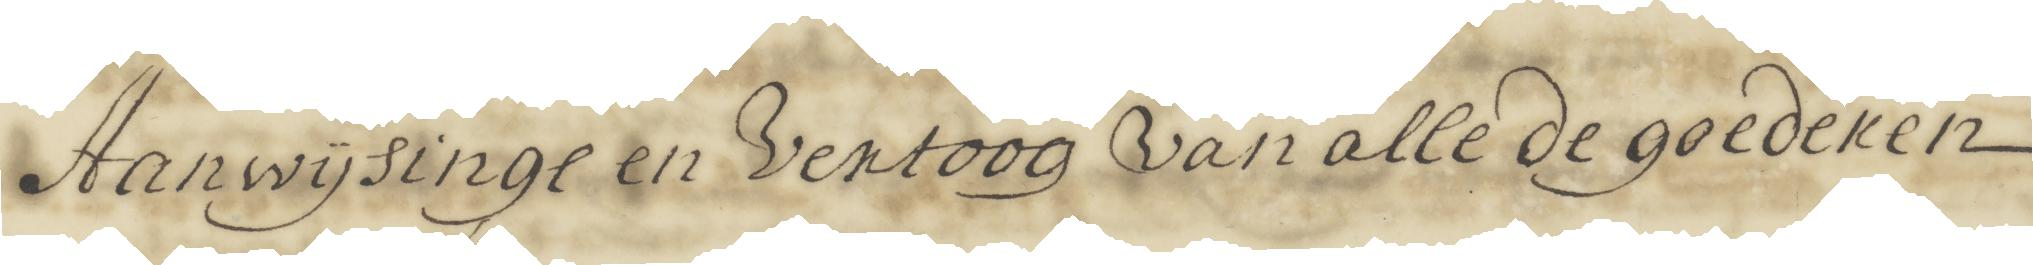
Aanwijsinge en vertoog van alle de goederen
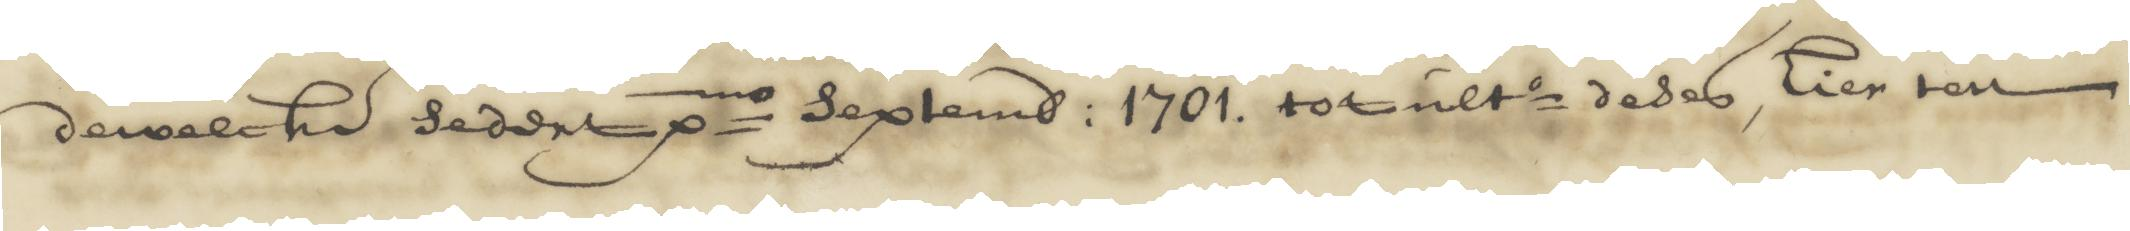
dewelcke sedert p=mo septemb: 1701. tot ult=o deses, hier ten
